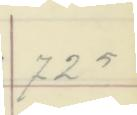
725
